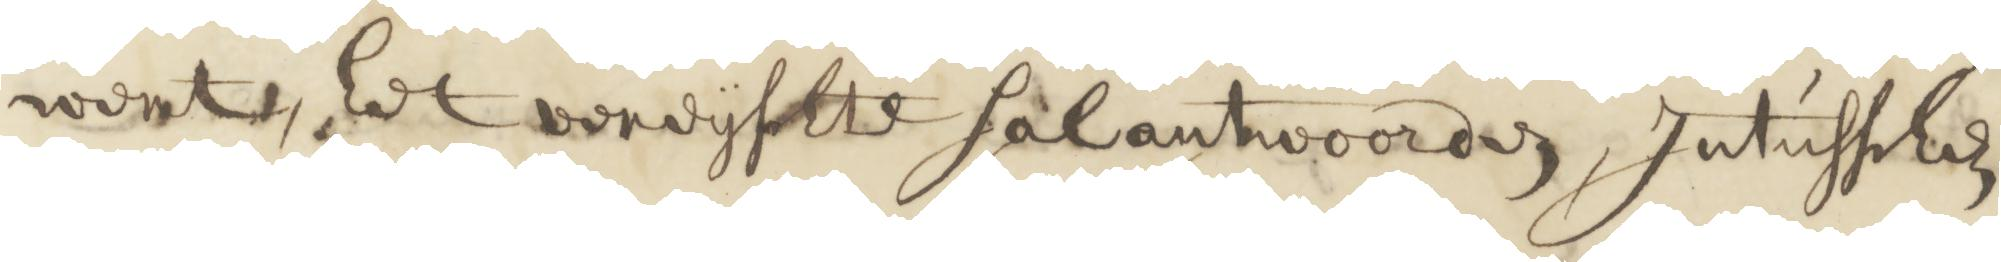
wert, het vereijschte sal antwoorden, Intusschen
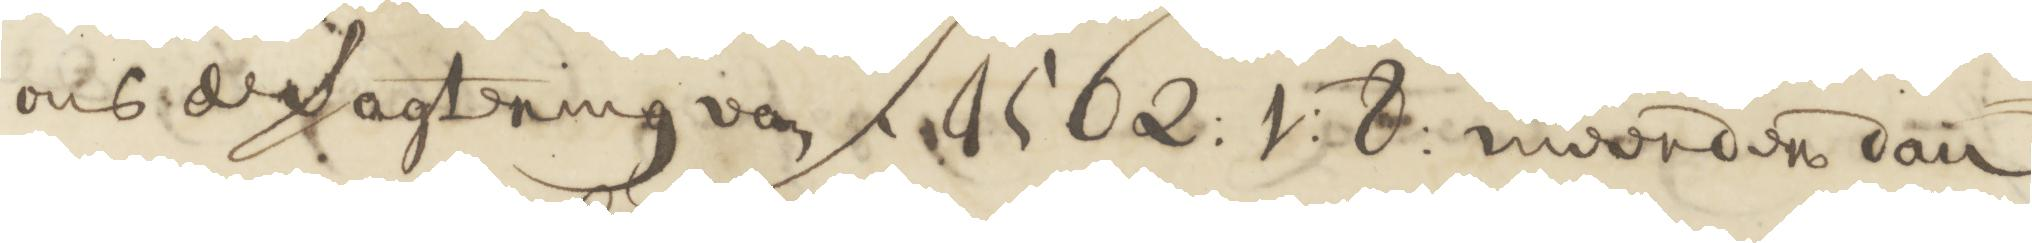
ons de veragtering van ƒ4562: 1: 8: meerder dan
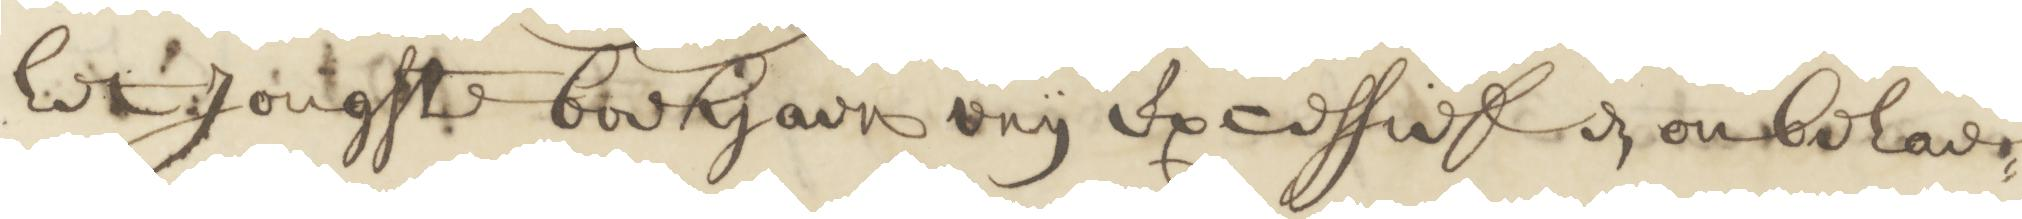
het jongste boekjaer vrij Excessief en onbehae„
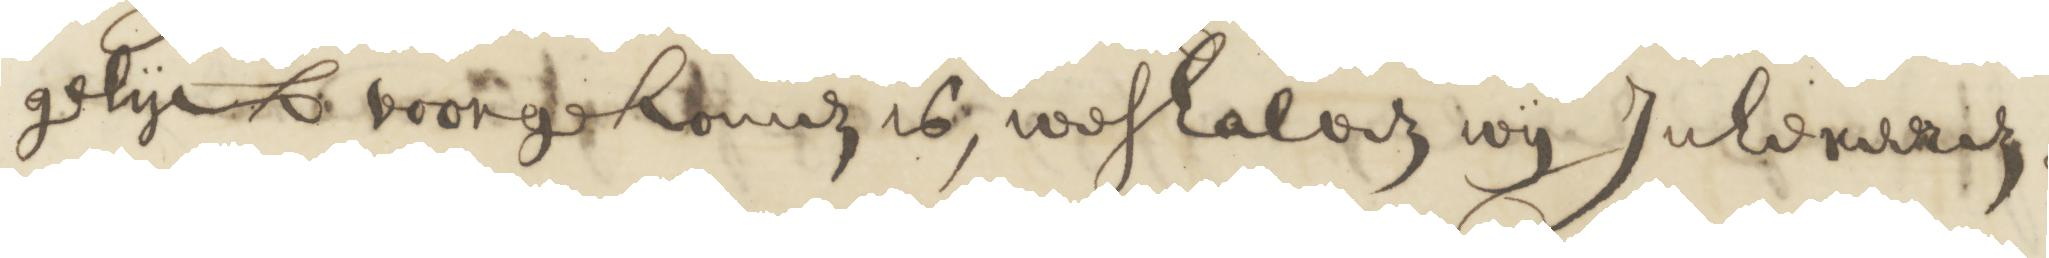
gelijck voorgekomen is, weshalven wij Inhereeren
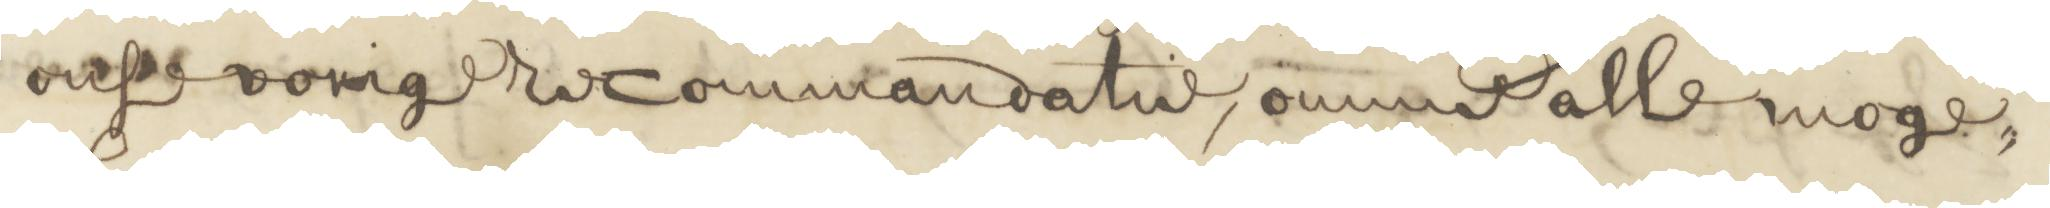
onse vorige recommandatie, omme alle moge„
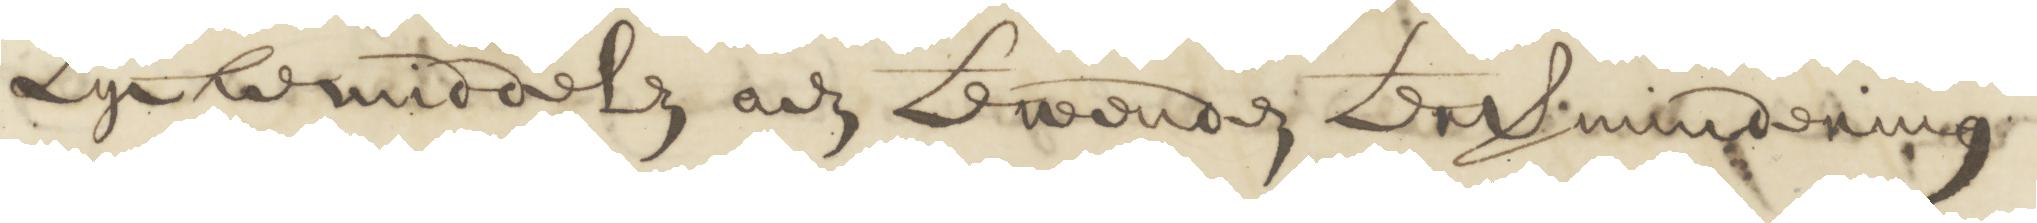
lijcke middelen aen te wenden tervermindering
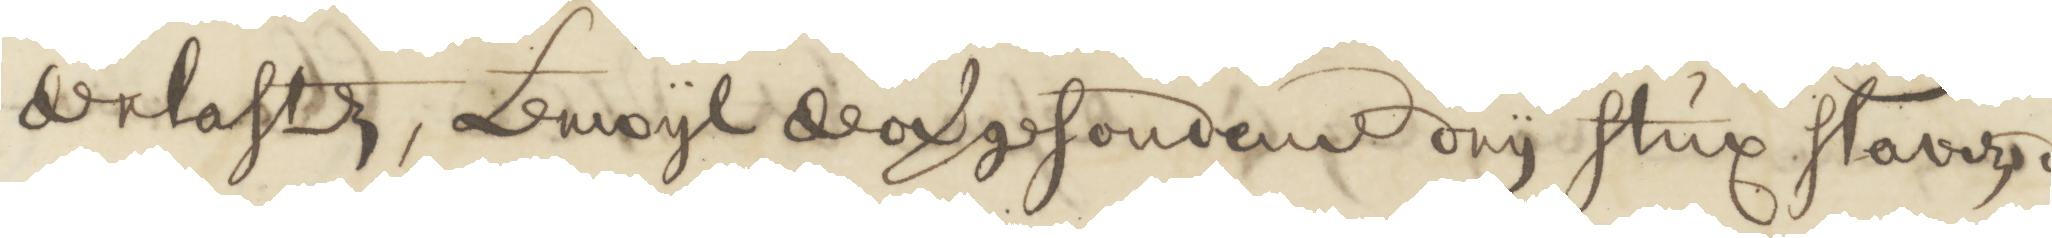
derlasten, terwijl de overgesondene drij stux slaven
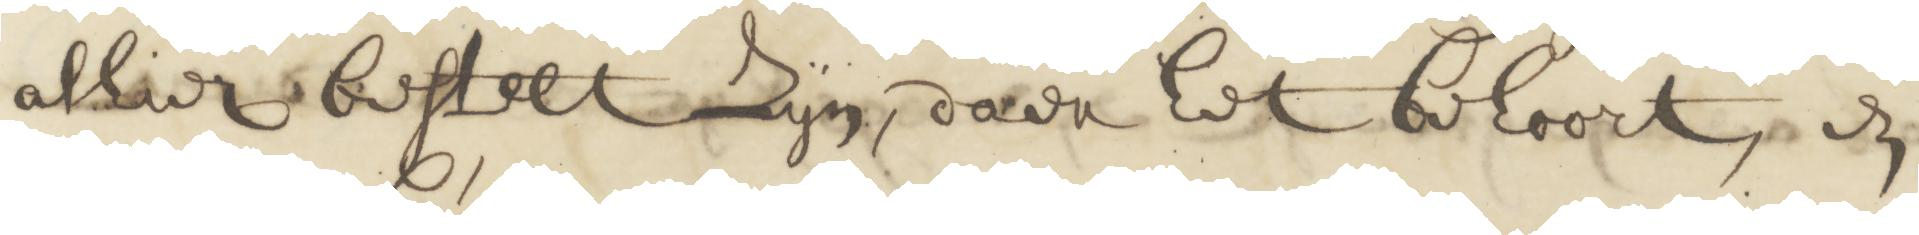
alhier bestelt Zijn, daer het behoort, en
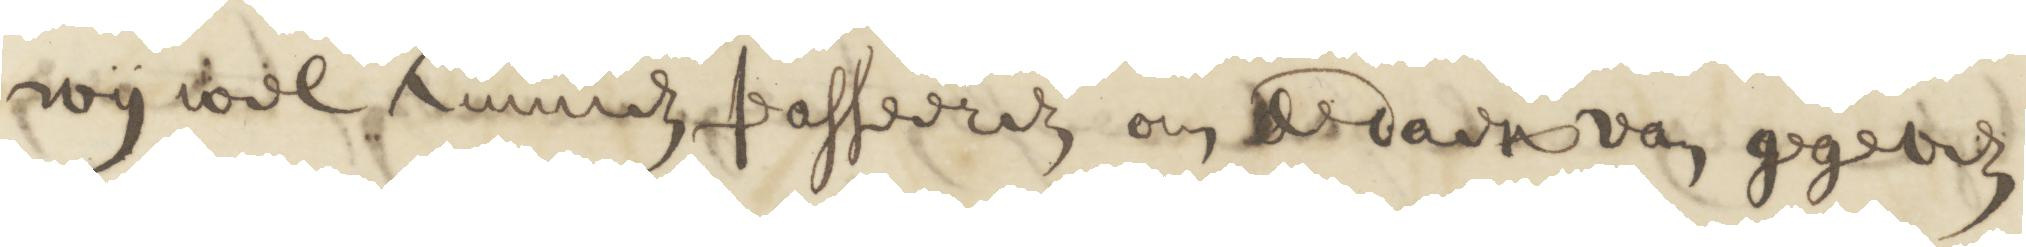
wij wel kunnen passeeren om de daer van gegeven
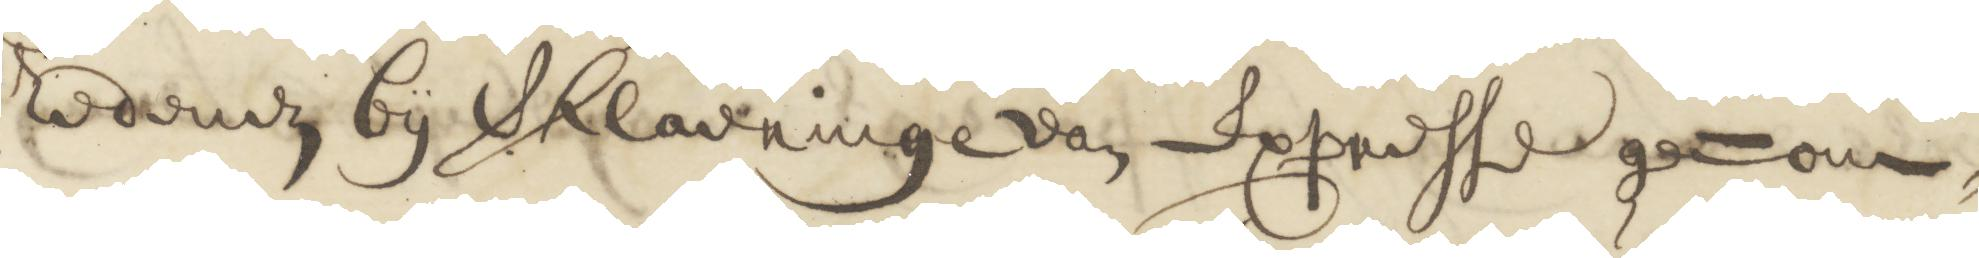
redenen bij verklaeringe van expresse gecom„
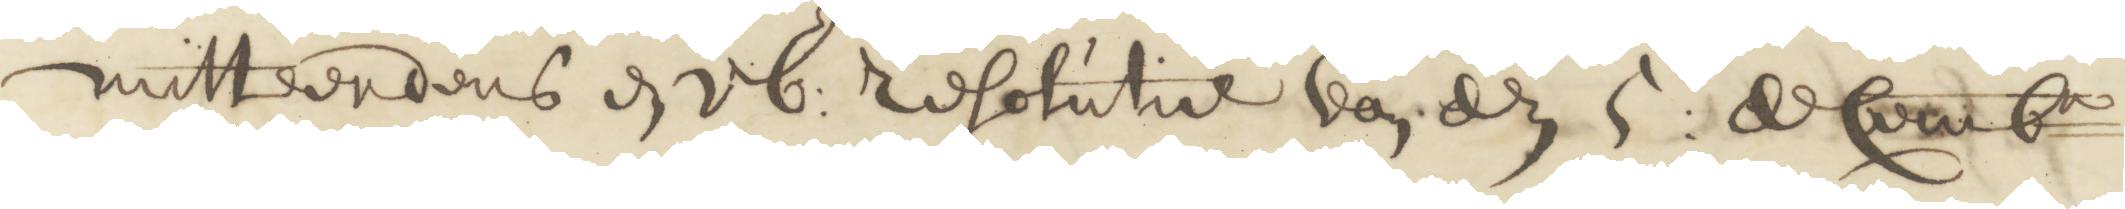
mitteerdens en UE: resolutie van den 5:' decemb=r
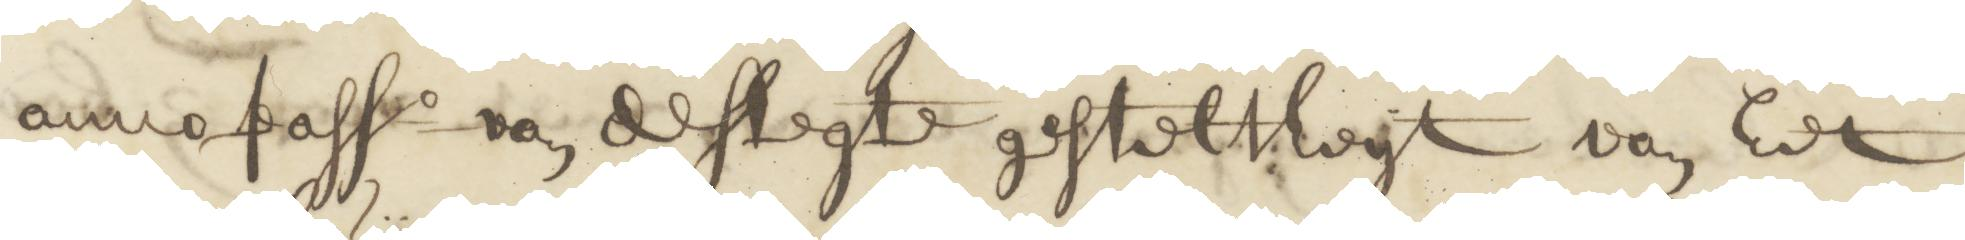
anno pass:o van de slegte gesteltheijt van het
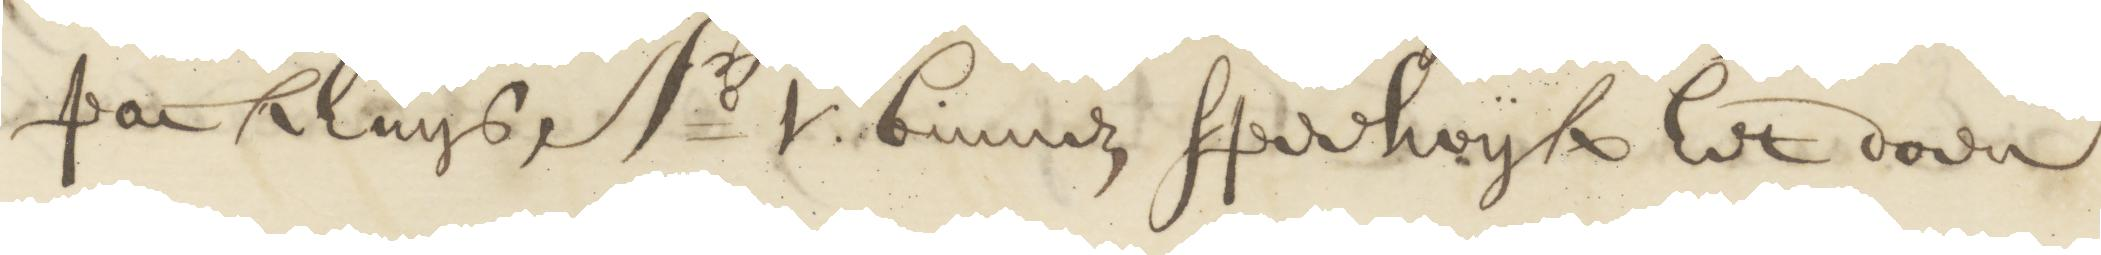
packhuijs N=o 1: binnen speelwijk het doen
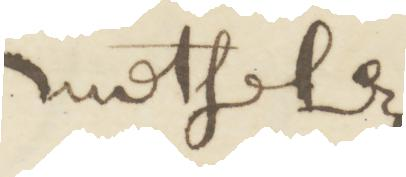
metselen
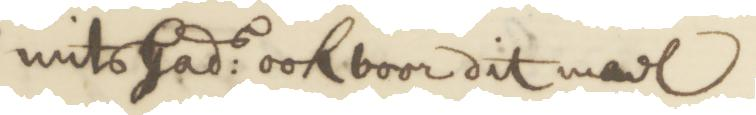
mitsgad:s ook voor dit mael
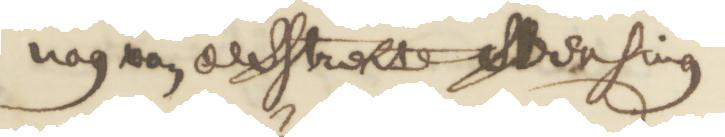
nog van de verstrekte verversing
